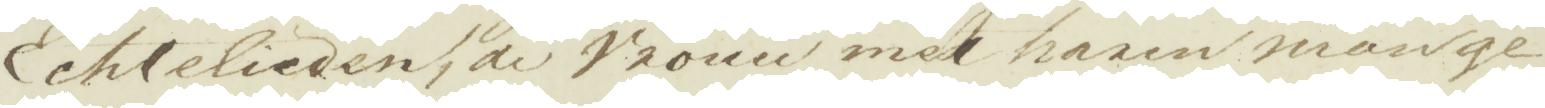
Echtelieden, de Vrouw met haren man ge
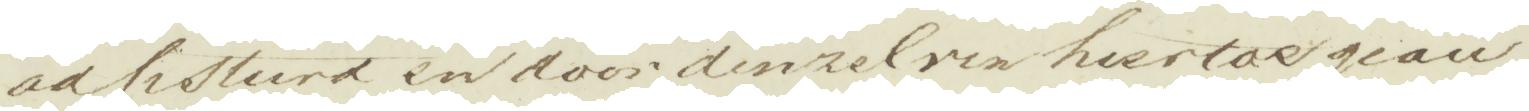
adsisteerd en door denzelven hiertoe geau
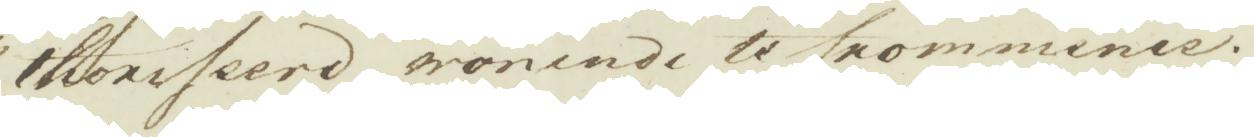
thoriseerd, wonende te Crommenie.
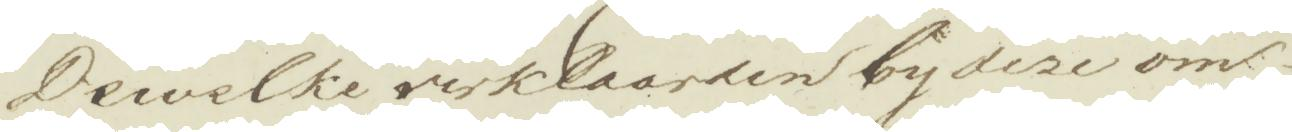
Dewelke verklaarden by deze om
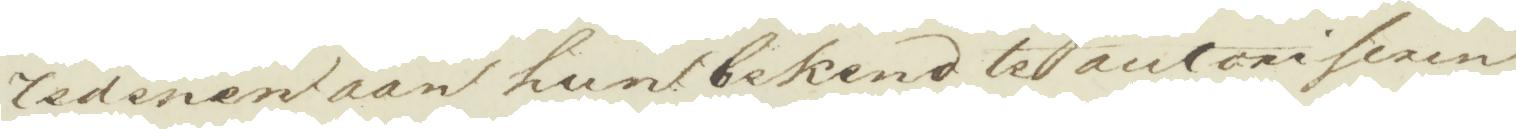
redenen aan hun bekend te autoriseren
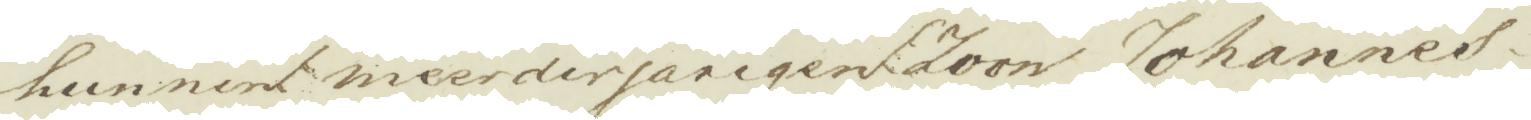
hunnen meerderjarigen Zoon Johannes
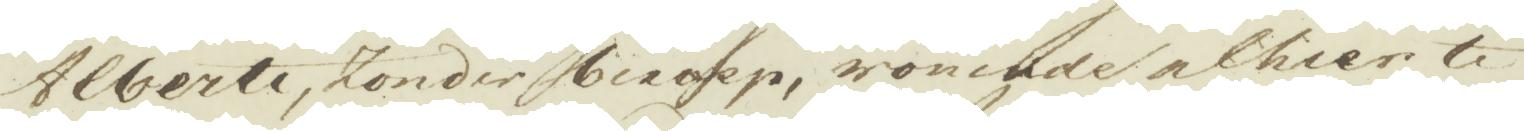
Alberti, zonder beroep, wonende alhier te
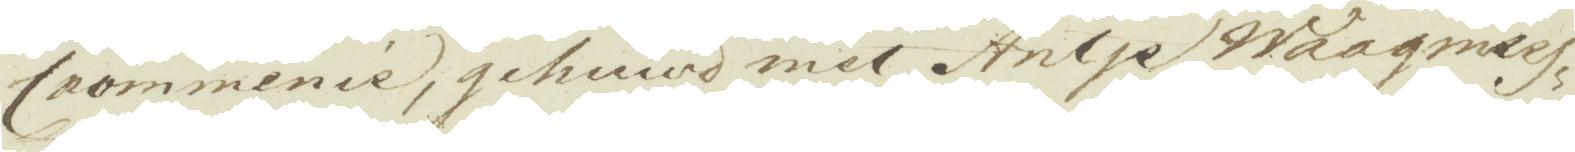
Crommenie, gehuwd met Antje Waagmees„
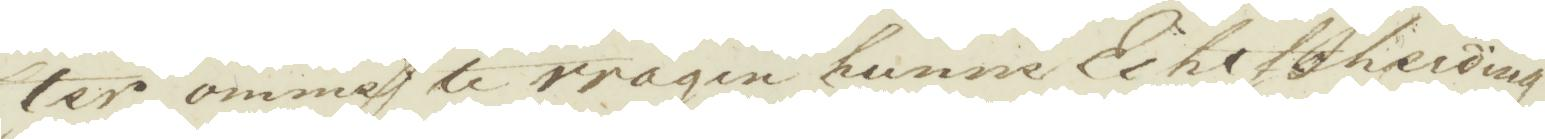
ter omme te vragen hunne Echtscheiding
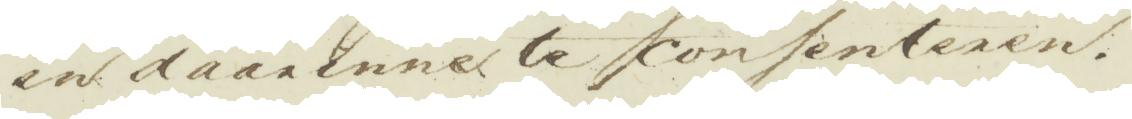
en daarinne te consenteren.
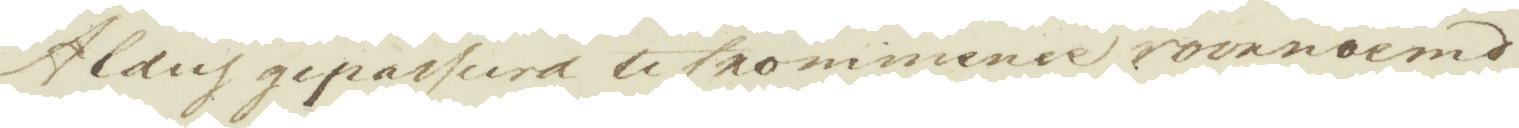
Aldus gepasseerd te Crommenie voornoemd
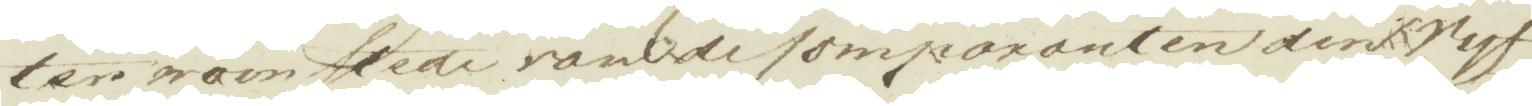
ten woonstede van de Comparanten den Vyf
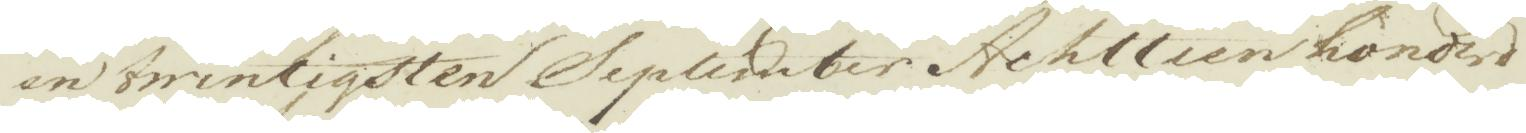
en twintigsten September Achttien honderd
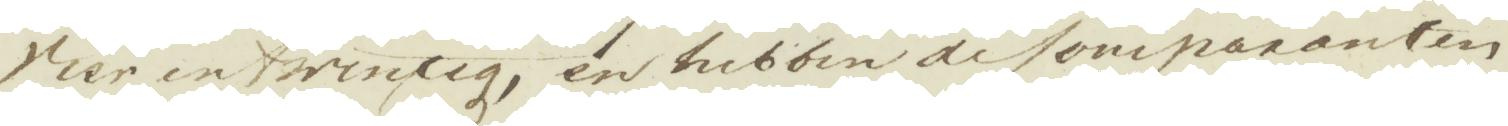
vier en twintig, en hebben de Comparanten
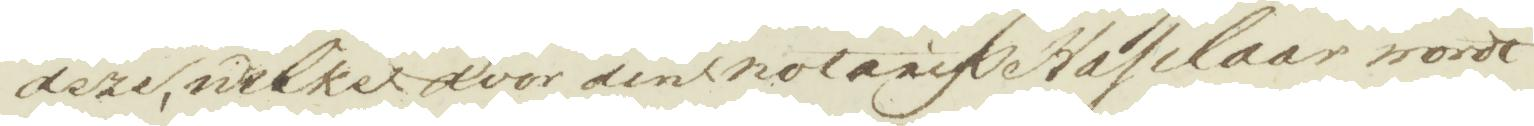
deze, welke door den notaris Haselaar wordt
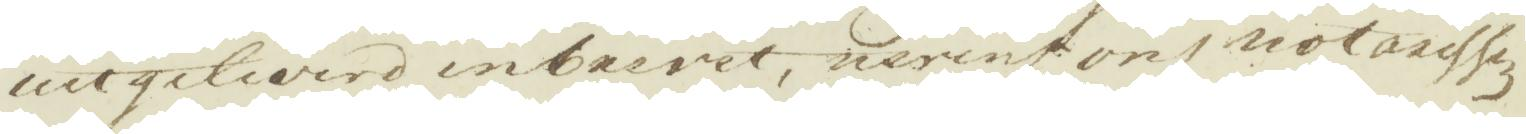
uitgeleverd in brevet, nevens ons notarissen
